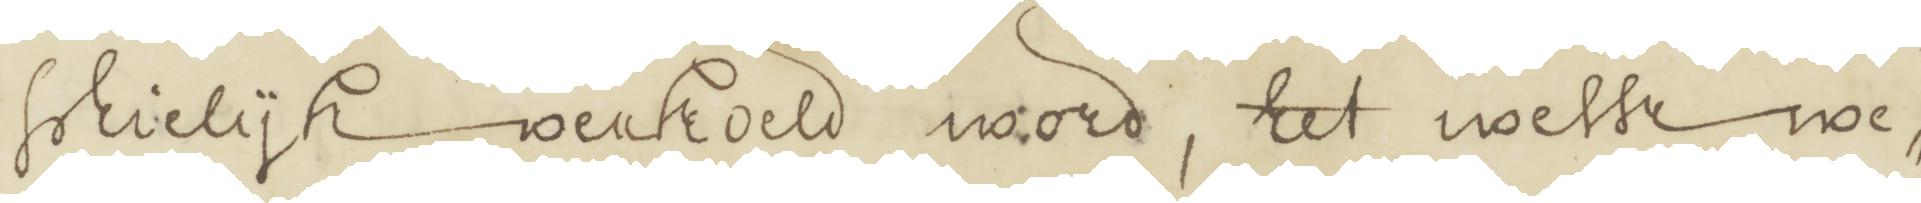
schielijk verkoeld word, het welk we„
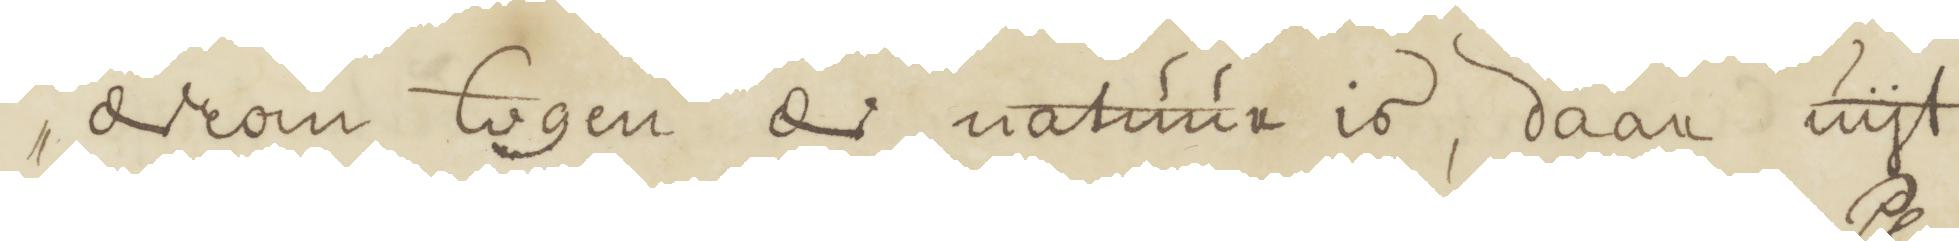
„derom tegen de natuur is, daar uijt
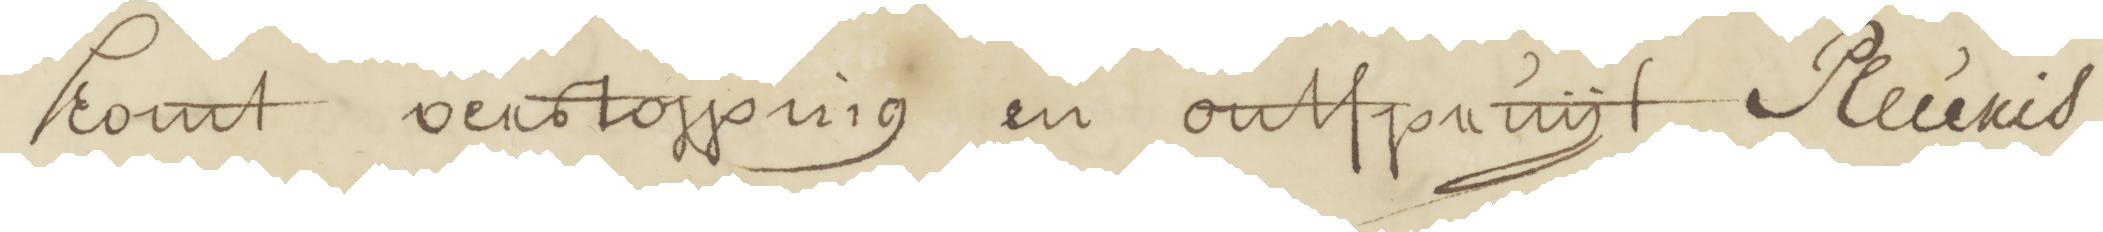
komt verstopping en ontspruijt Pleuris
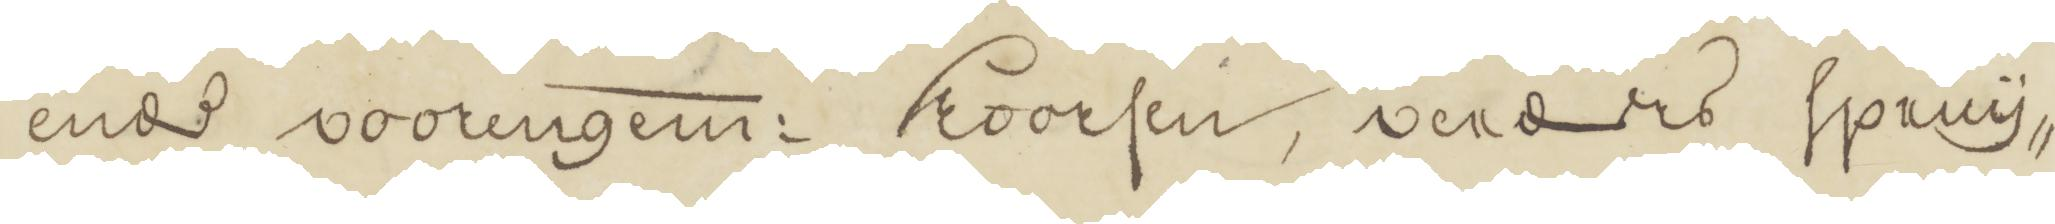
ende voorengem: koorsen, verders spruij„
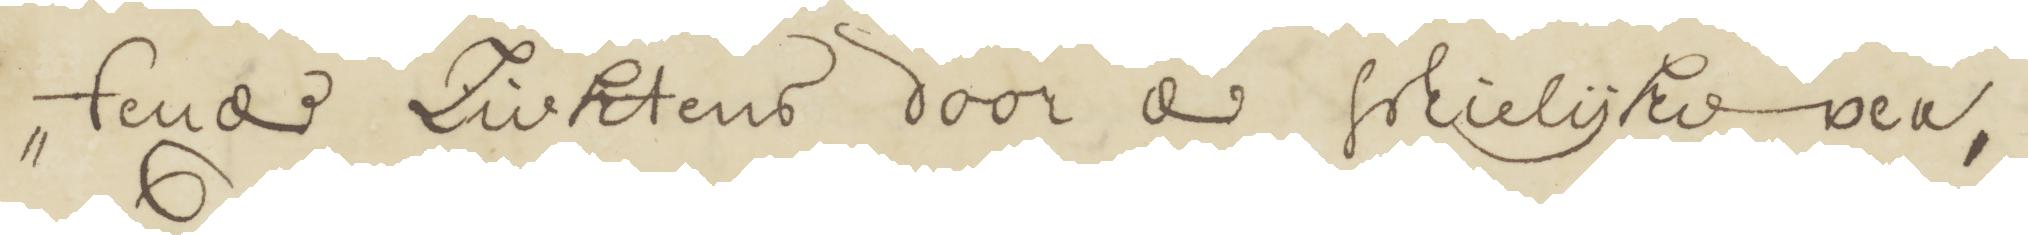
„tende ziektens door de schielijke ver,
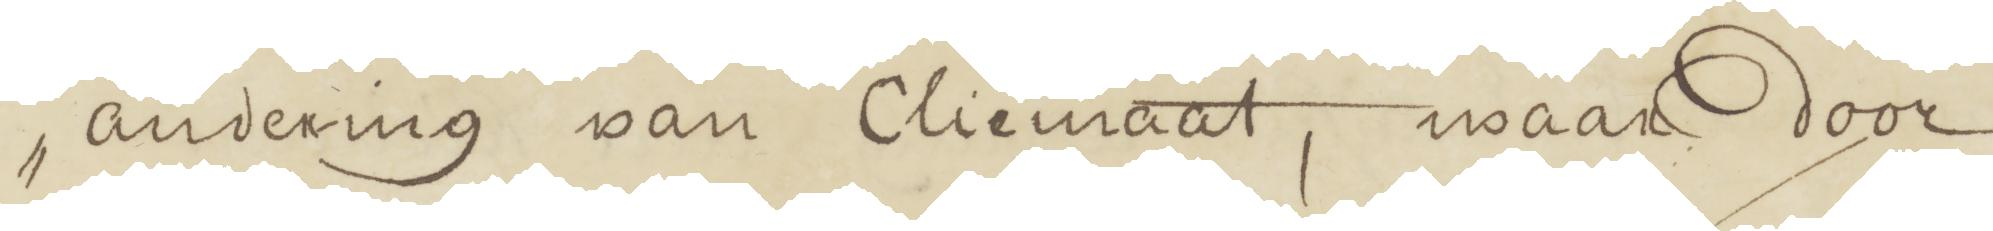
„andering van Cliemaat, waar door
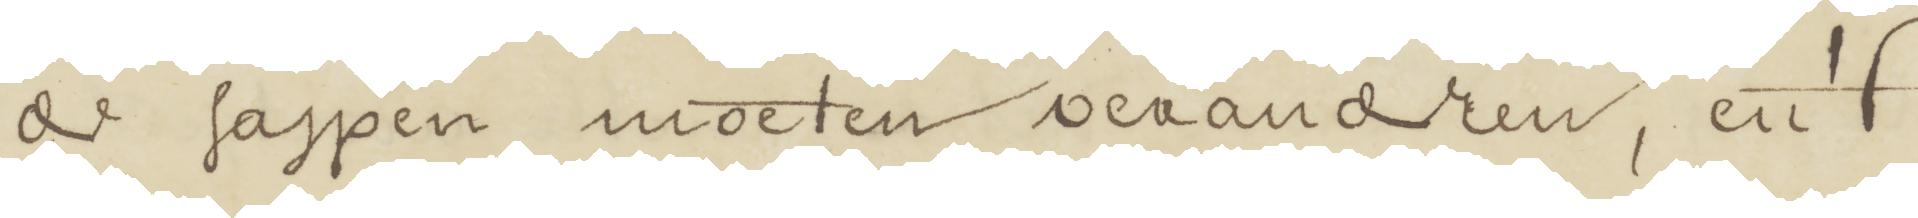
de sappen moeten veranderen, en ’t
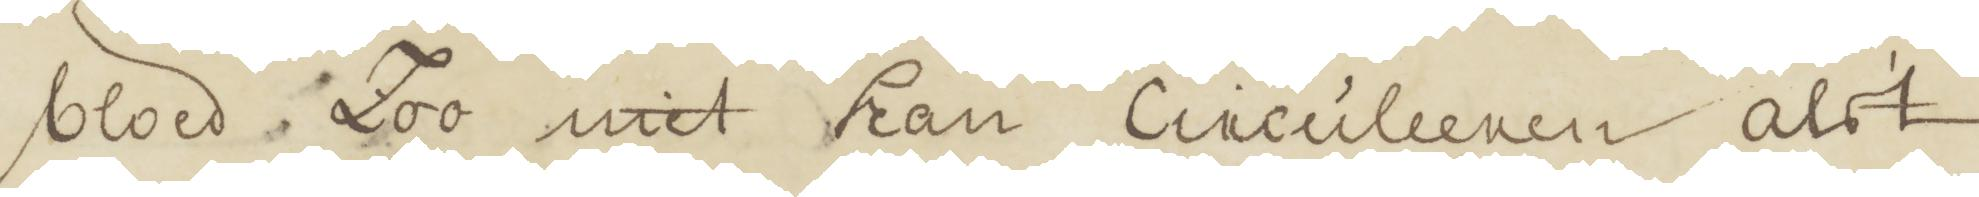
bloed zoo niet kan circuleeren als't
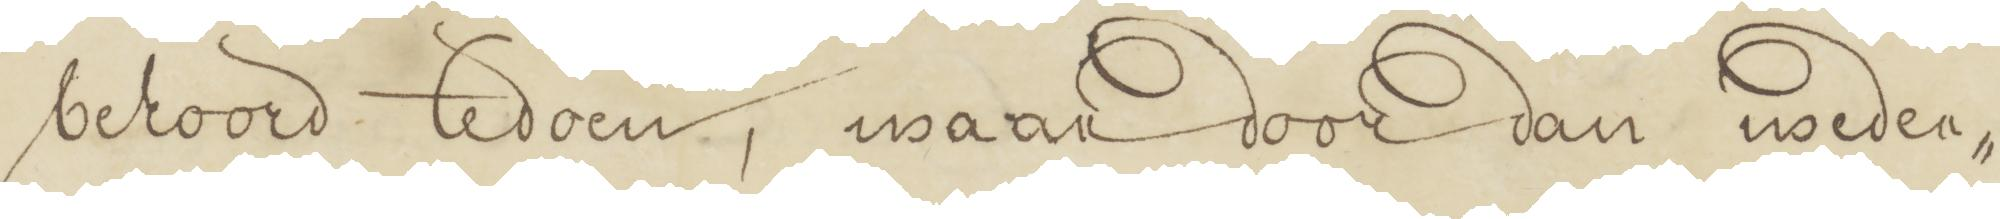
behoord tedoen, waar door dan weder„
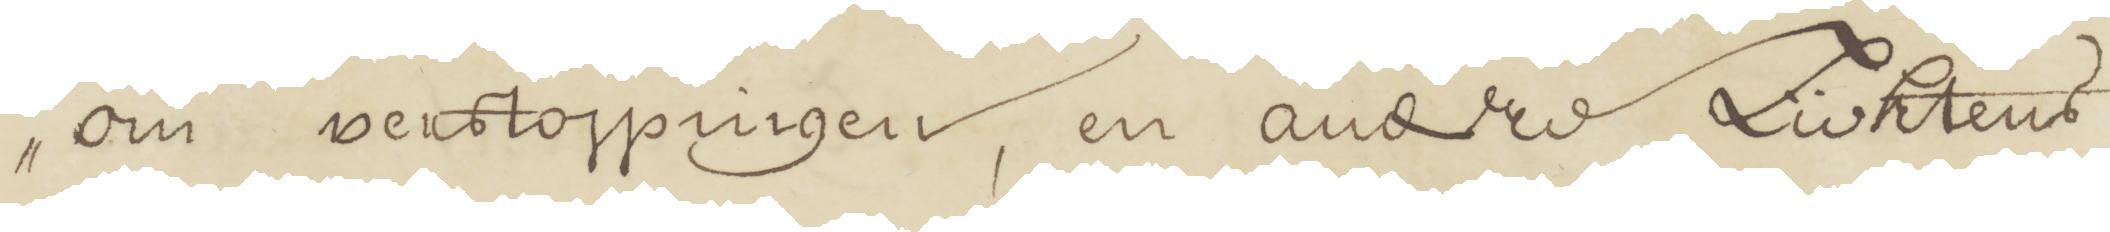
„om verstoppingen, en andere ziektens
